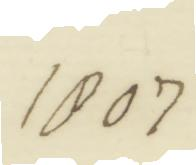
1807
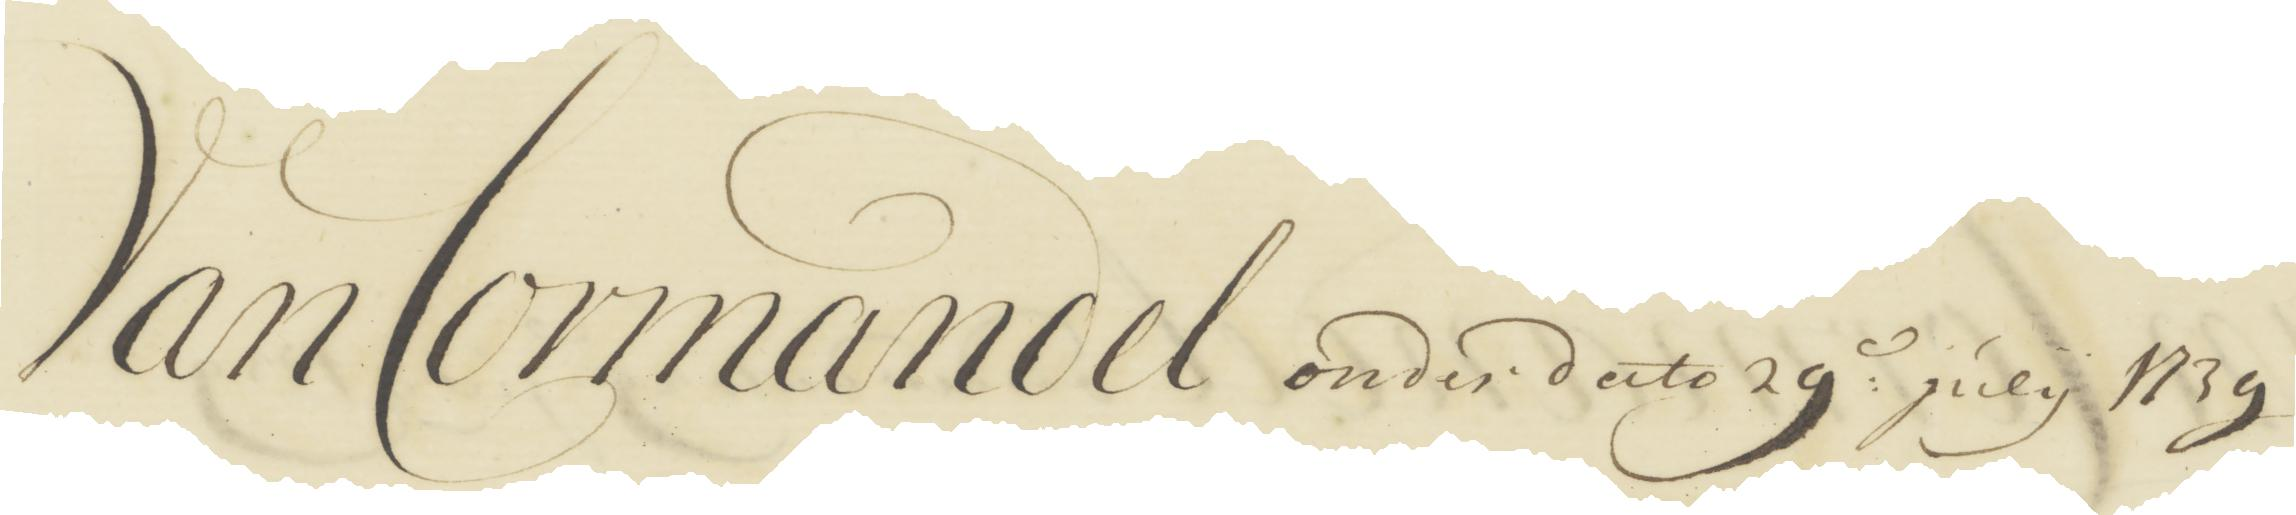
Van Cormandel onder dato 29:e julij 1739
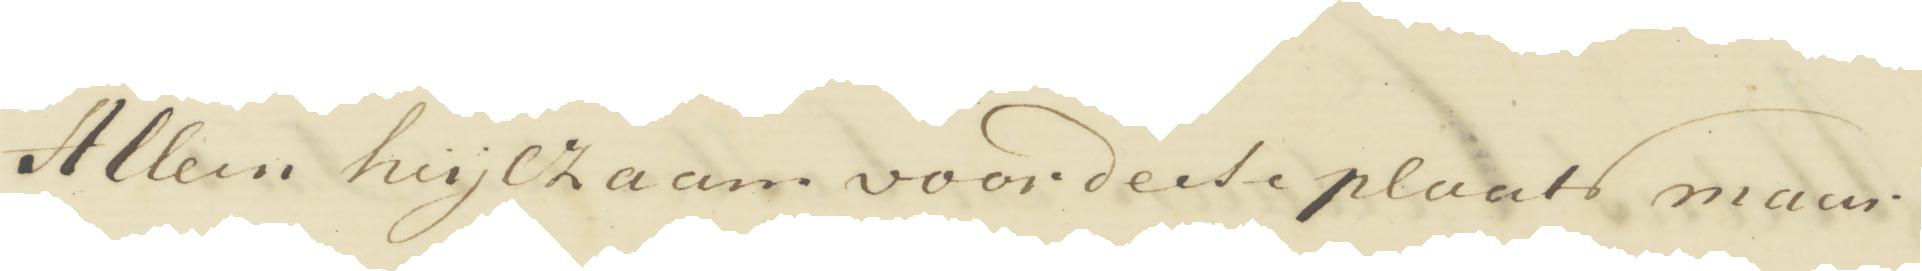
Alleen heijlzaam voor deese plaats maar
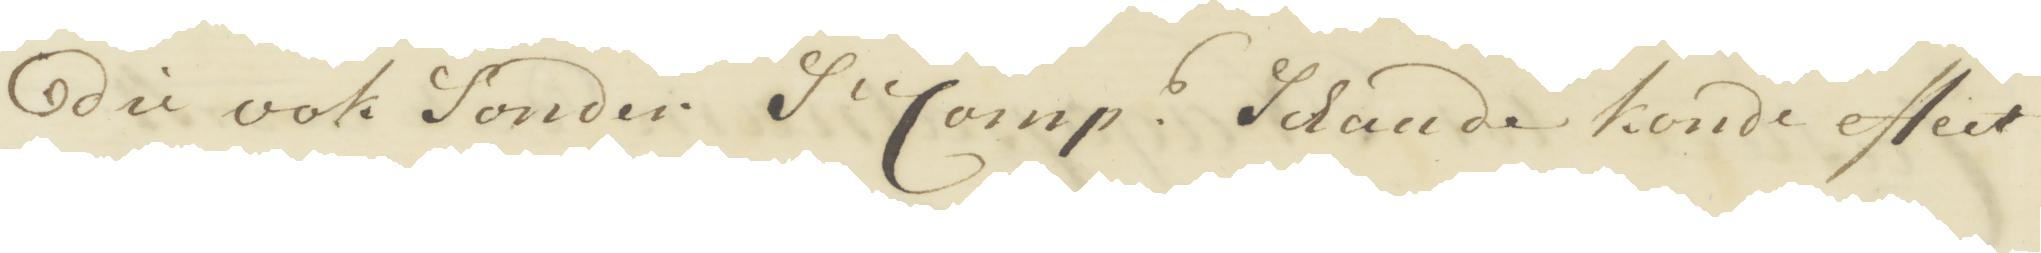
die ook Sonder S:e Comp:s Schaade konde effect
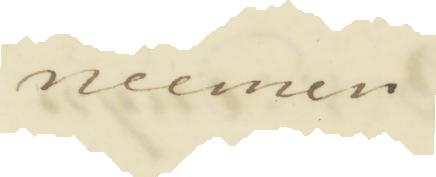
neemen.
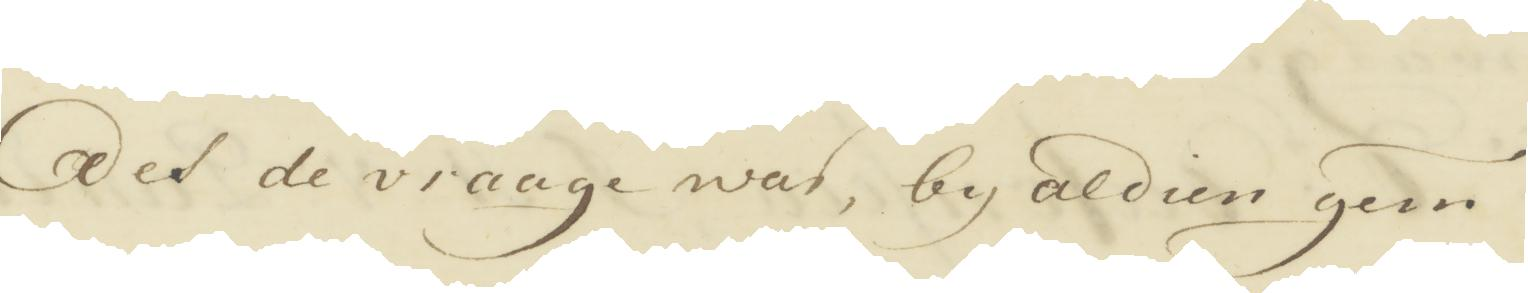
Des de vraage was, by aldien gem
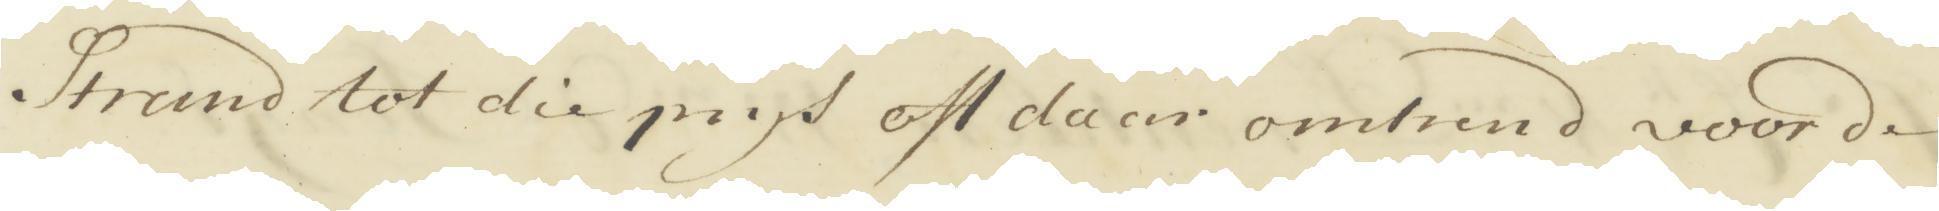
Strand tot die prys oft daar omtrend voor de
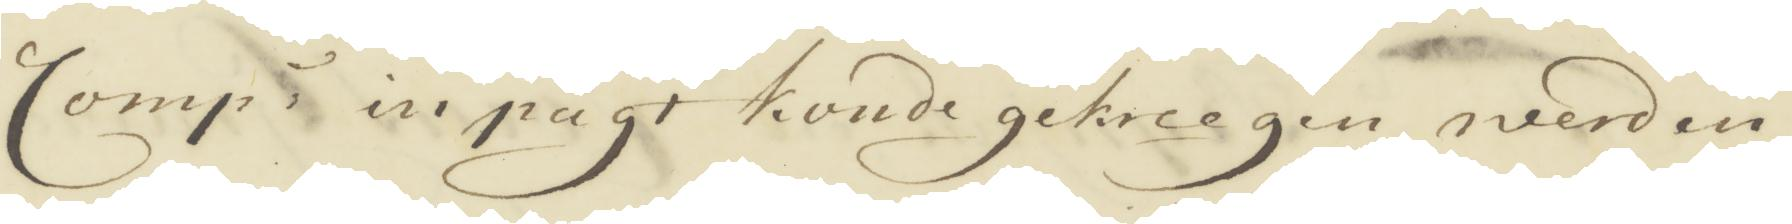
Comp:e in pagt konde gekreegen werden
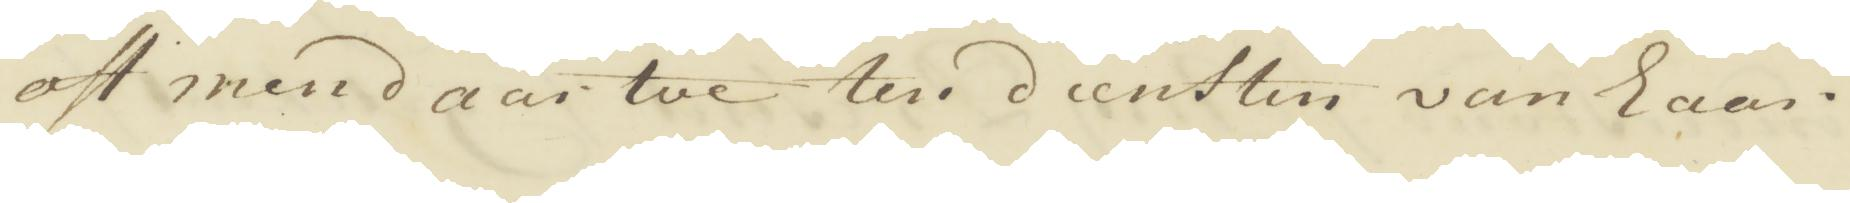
oft men daar toe ten diensten van haar
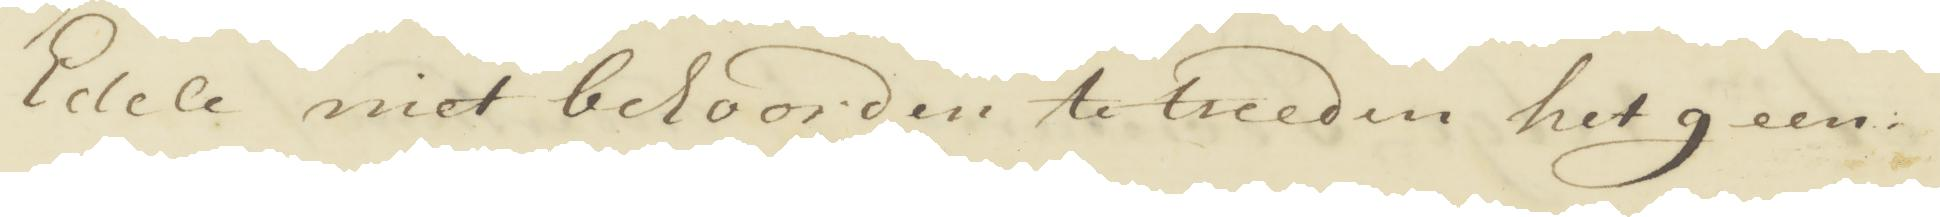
Edele niet behoorden te treeden het geen
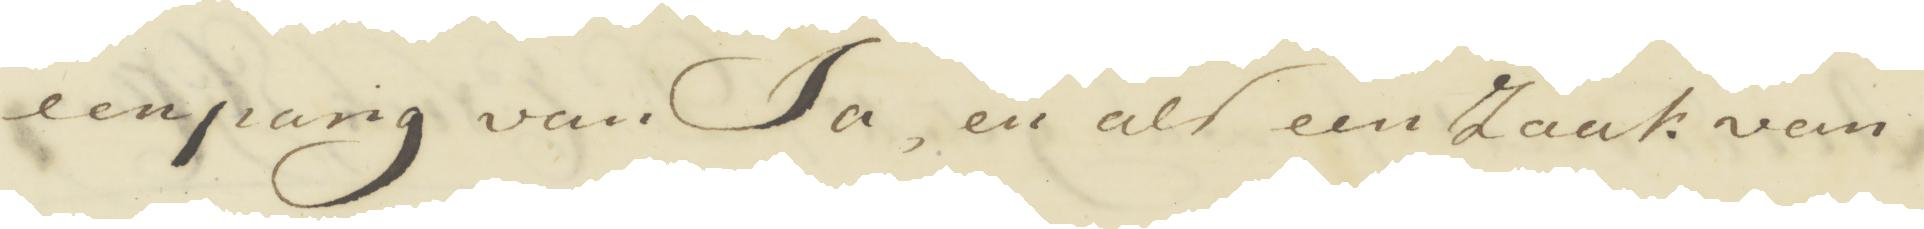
eenparig van Ia, en als een Zaak van
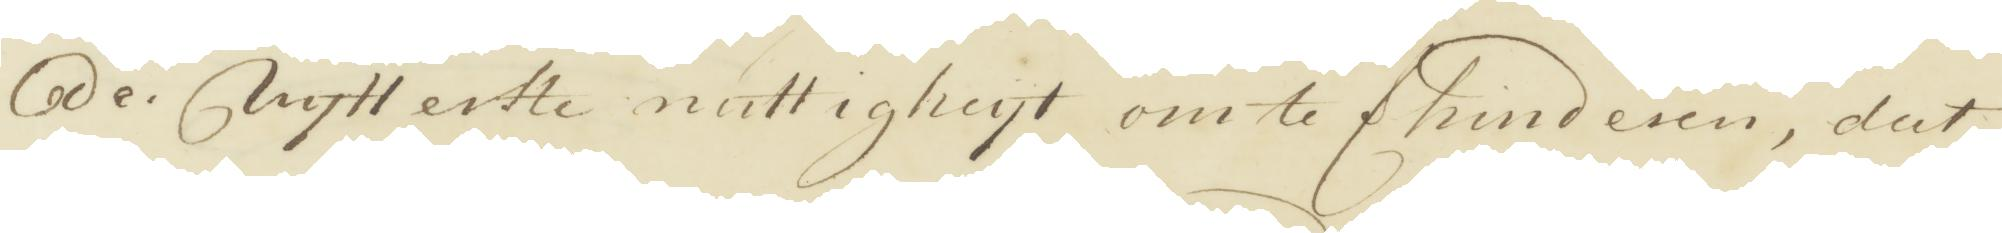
de uytterste nuttigheijt om te verhinderen, dat
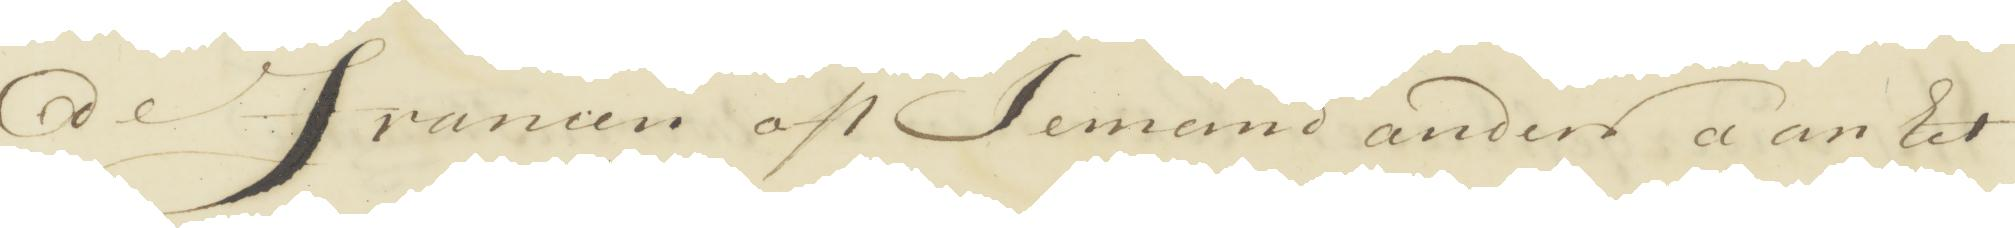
de Francen oft Iemand anders aan het
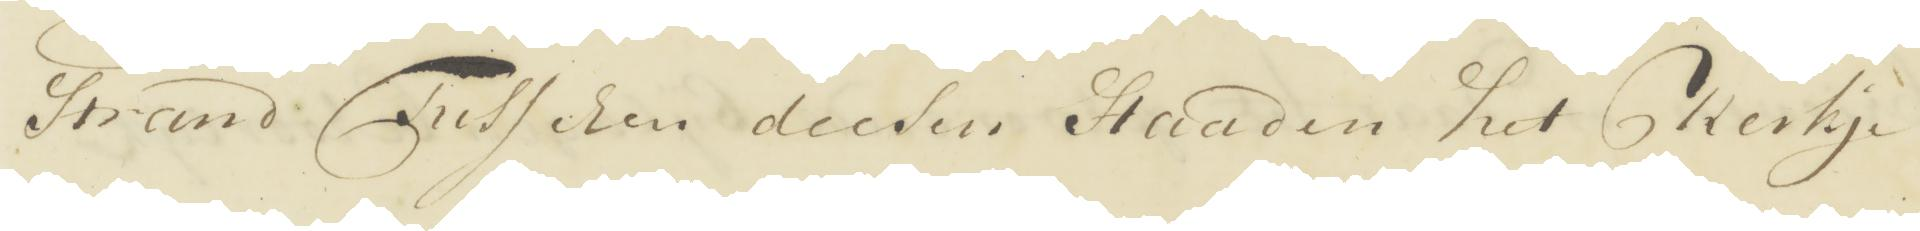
strand Tusschen deesen Staad en het Kerkje
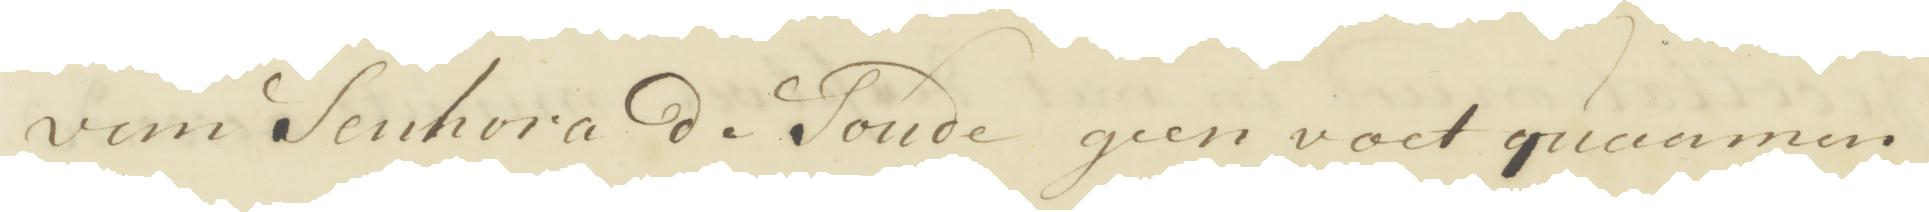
van Senhora de Soude geen voet quaamen
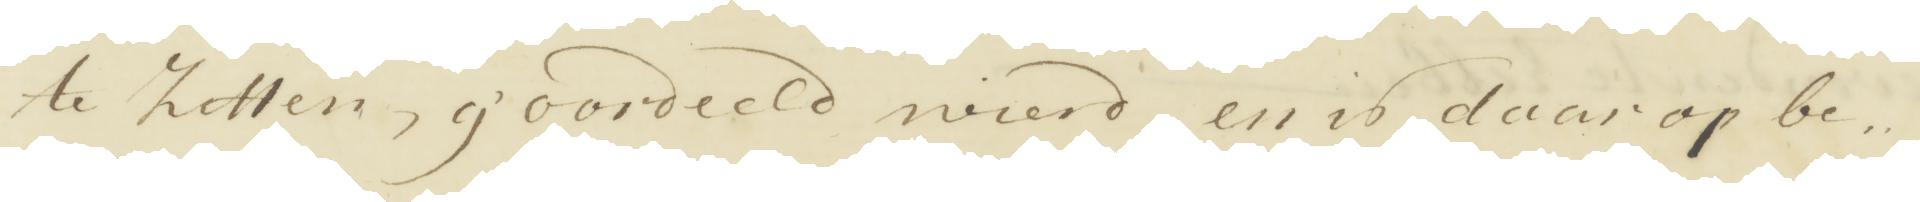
te Zetten, g’oordeeld wierd, en is daar op be„
